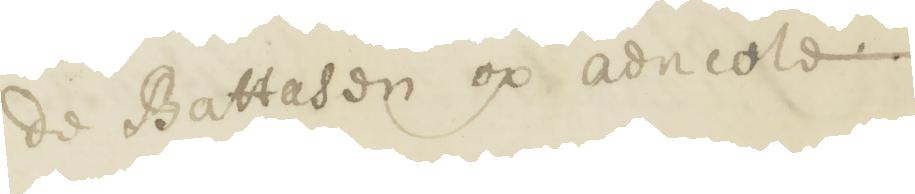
de Battasen op aen cote.
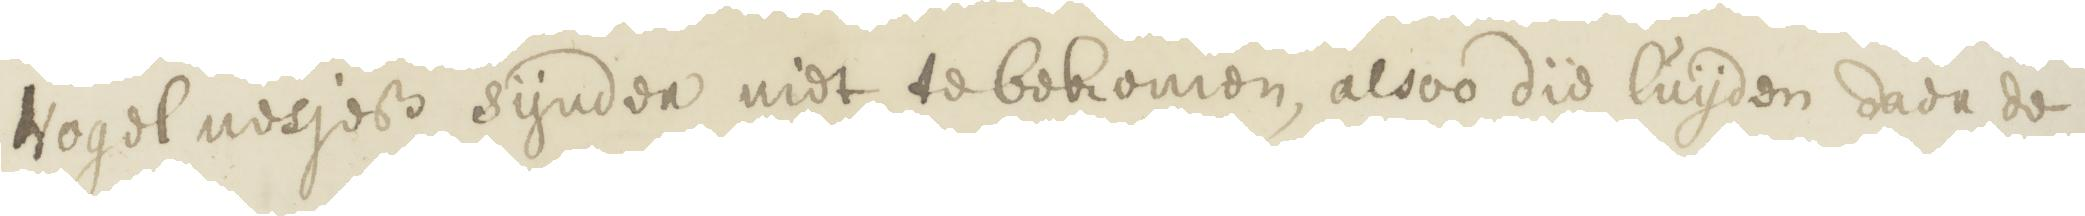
Vogel nesjes sijnder niet te bekomen, alsoo die luijden daer de
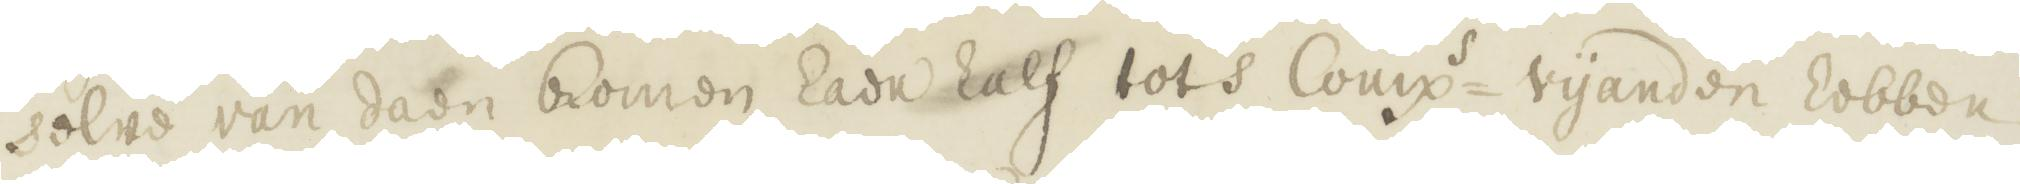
selve van daen komen, haer half tot ’s Comp=s vijanden hebben
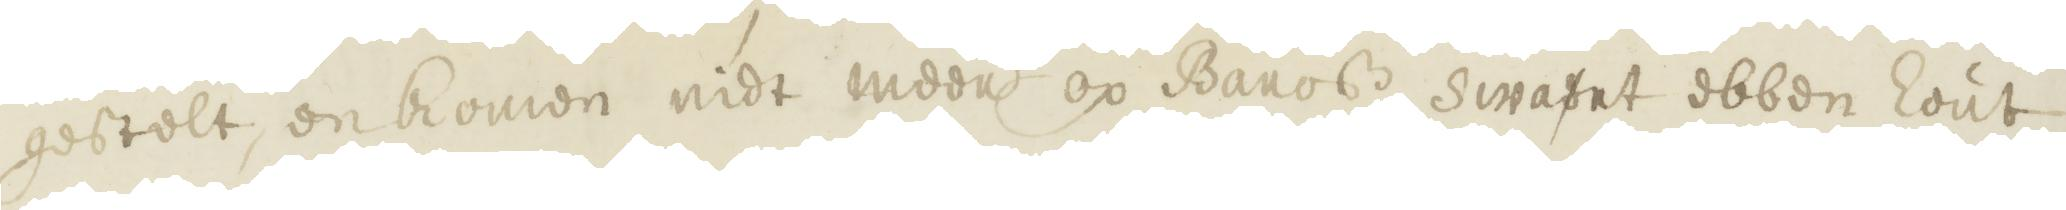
gestelt, en komen niet meer op Baros, swaert ebben hout
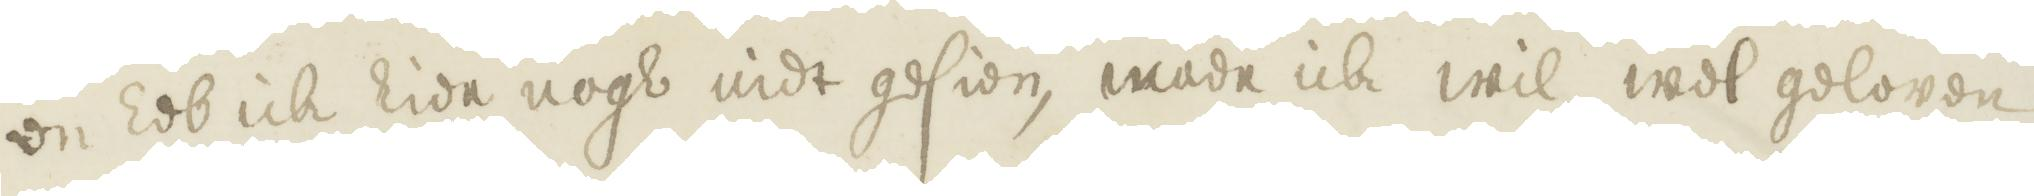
en heb ick hier nogh niet gesien, maer ick wil wel geloven
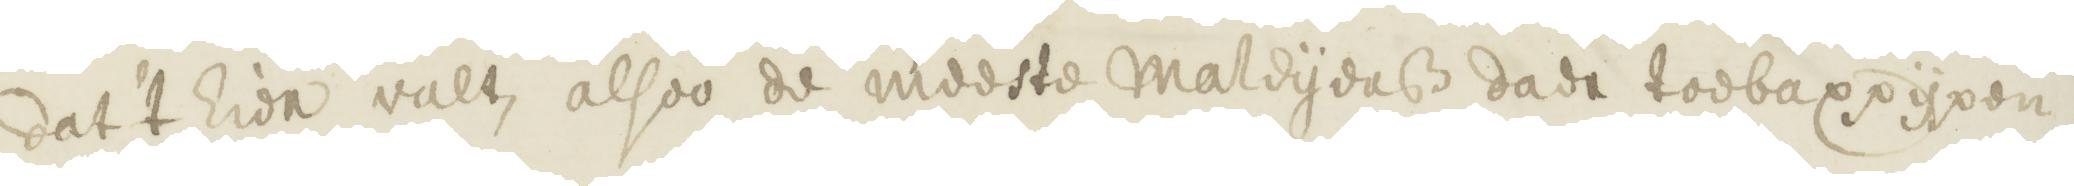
dat ’t hier valt, alsoo de meeste maleijers daer toebaxpijpen
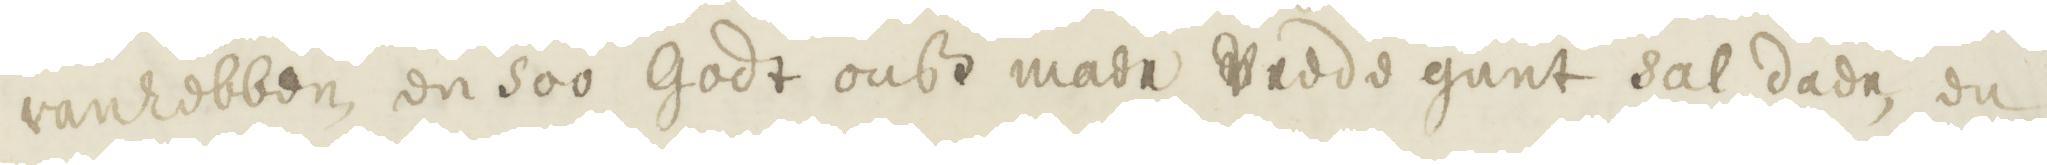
van hebben, en soo Godt ons maer vrede gunt sal daer, en
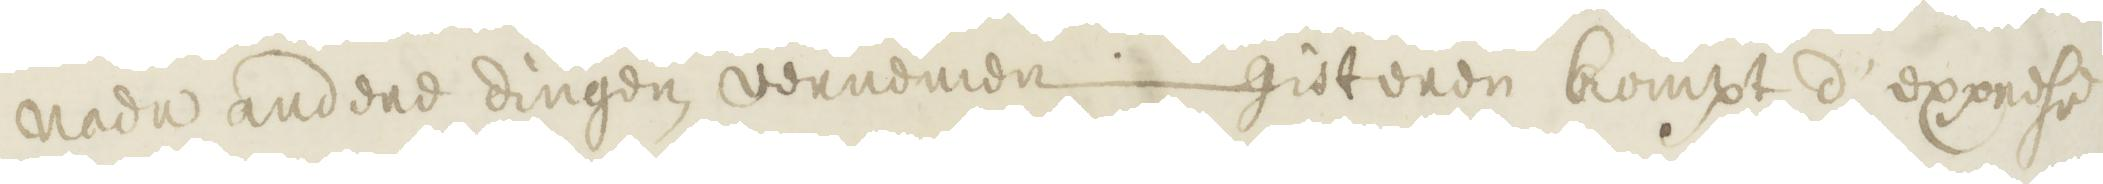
naer andere dingen, vernemen. gisteren kompt d’exprese
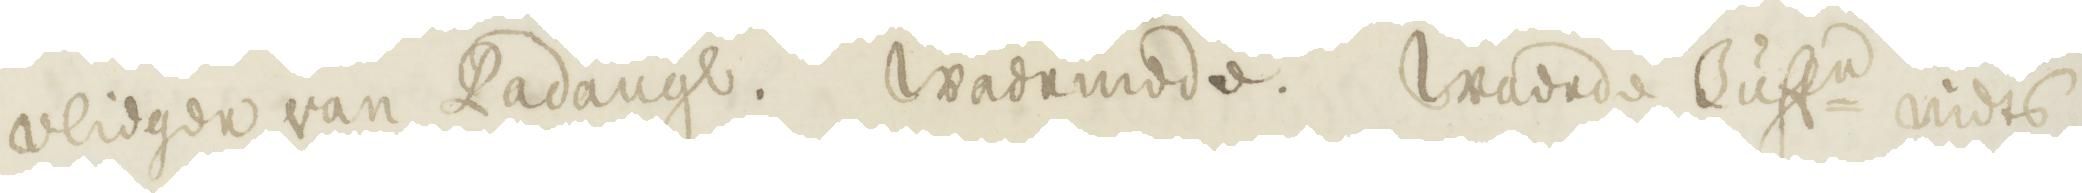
vlieger van Padangh. Waermede. waerde Juff=r niets
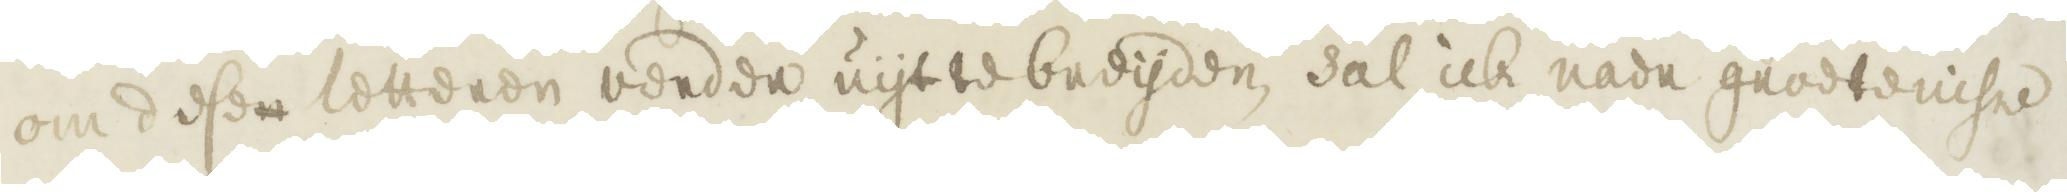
om desen letteren verder uijt te breijden, sal ick naer groetenisse
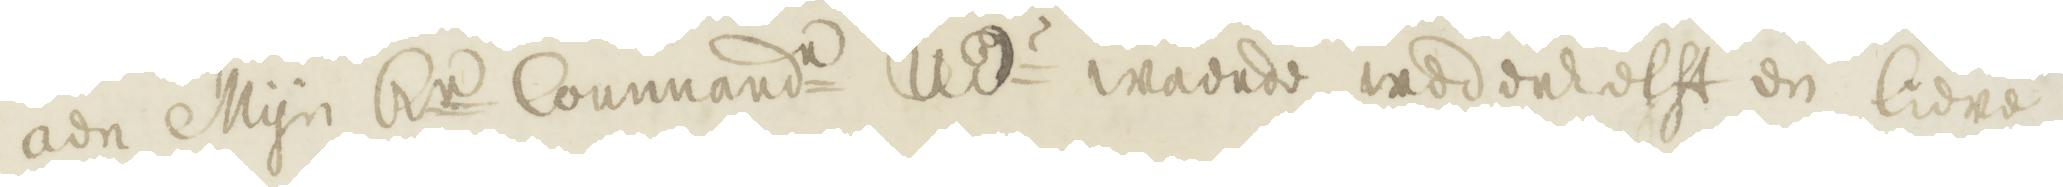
aen Mijn H=r Comand=r UE=' waerde wederhelft en lieve
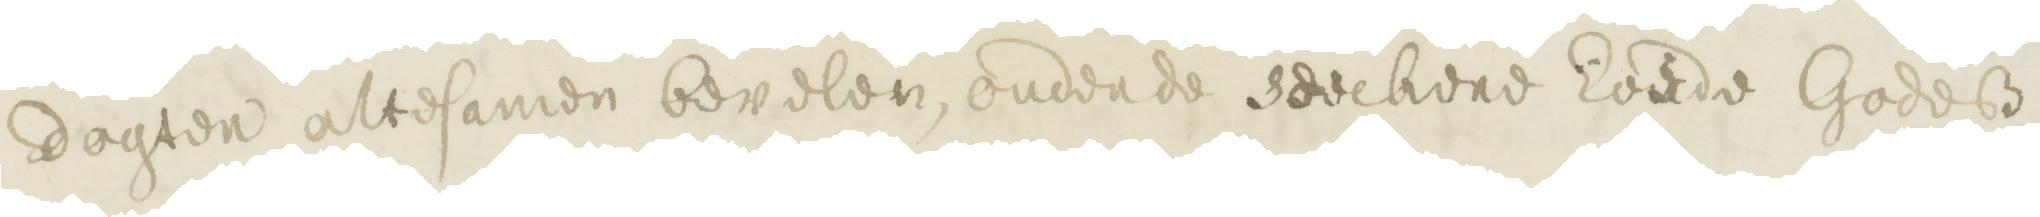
dogter altesamen bevelen, onder de seeckere heede Godes
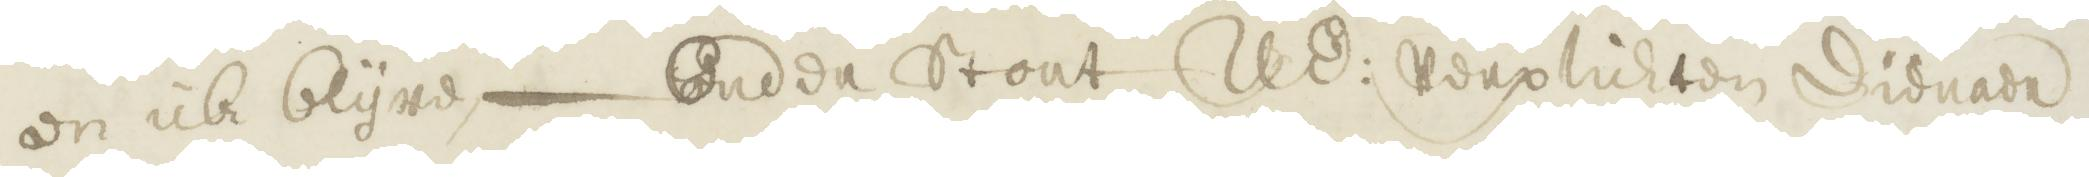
en ick blijve, Onder stont UE: verplichten Dienaer
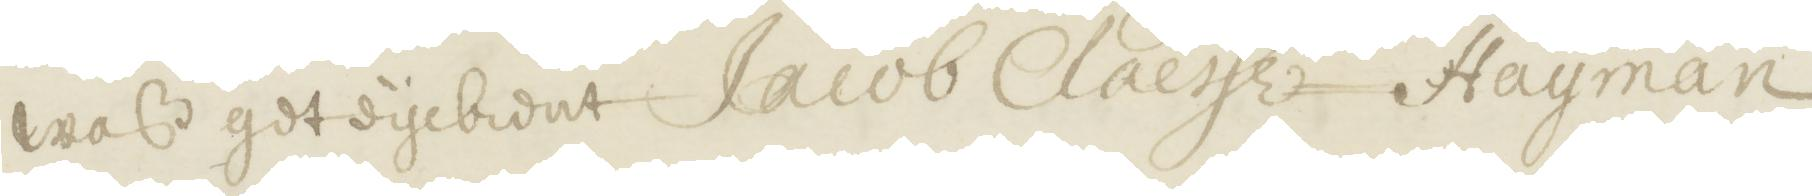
was geteijckent Jacob Claessh= Haijman
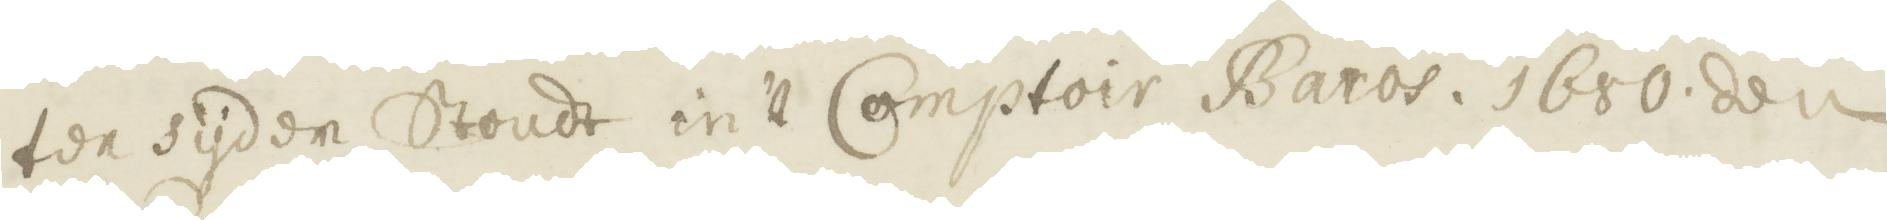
ter sijden stondt in ’t Comptoir Baros. 1680. den
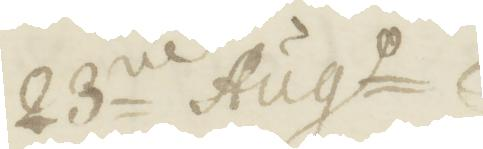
23=en Augt=o
